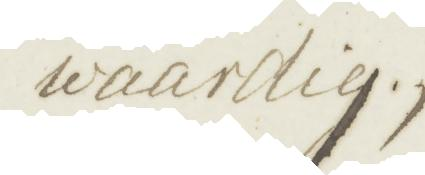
waardig.
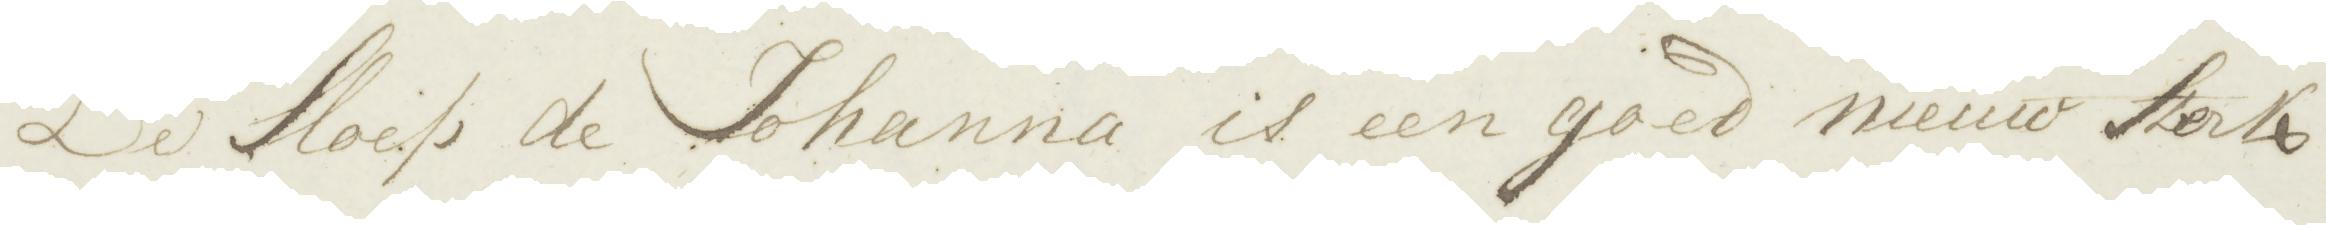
De Sloep de Iohanna is een goed nieuw sterk
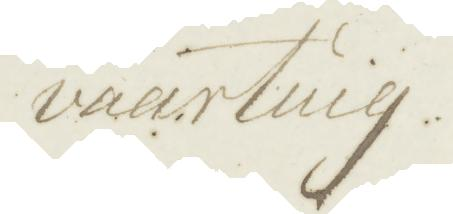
vaartuig.
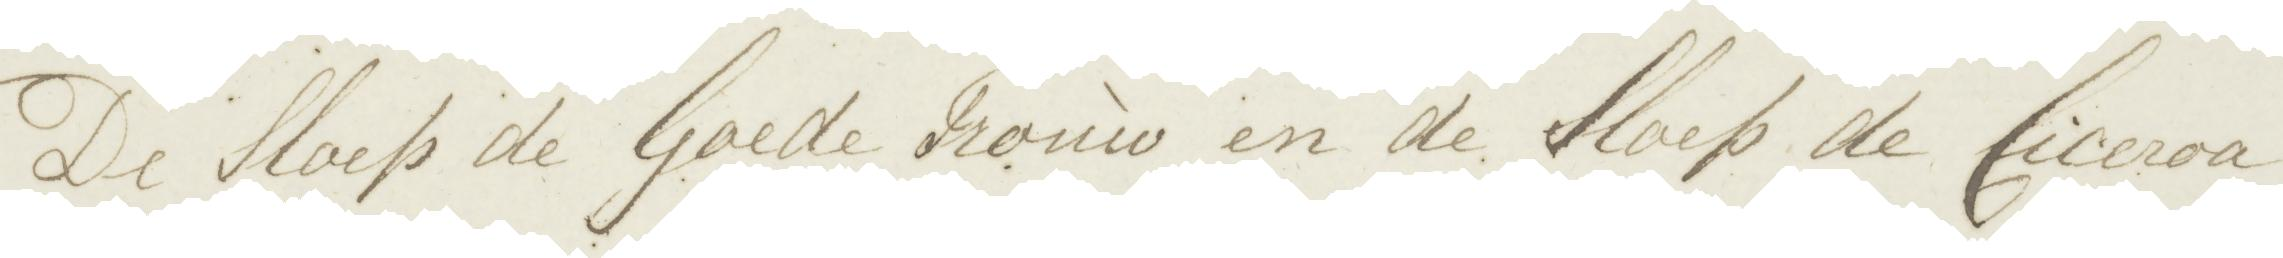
De Sloep de Goede Trouw en de Sloep de Ciceroa
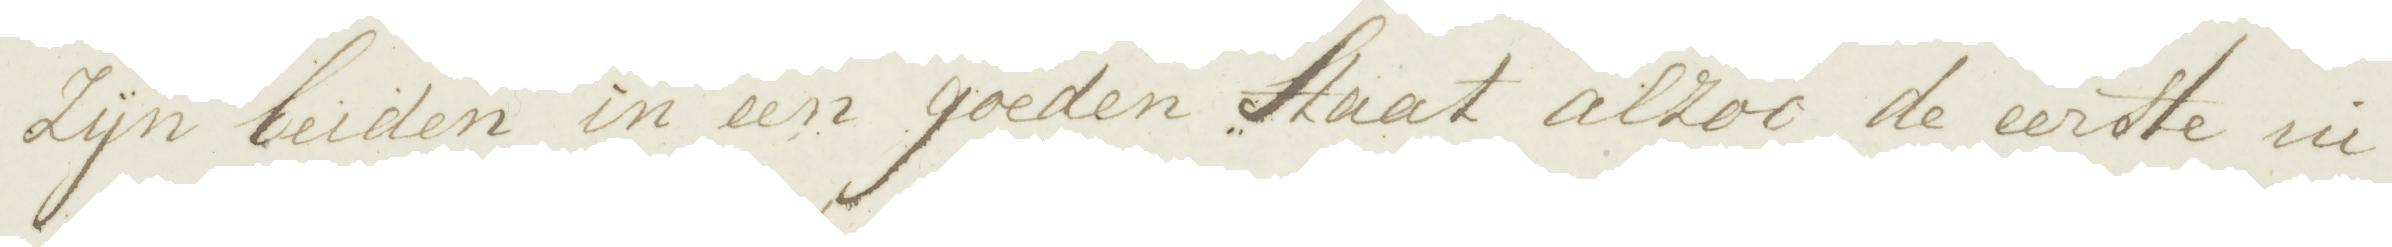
Zijn beiden in een goeden Staat alzoo de eerste in
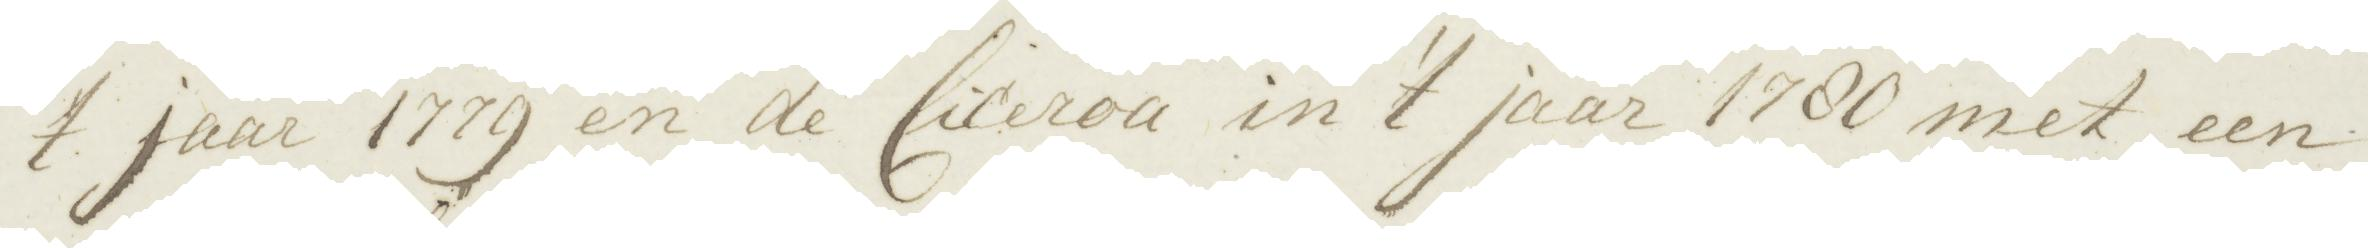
't Jaar 1779 en de Ciceroa in ’t jaar 1780 met een
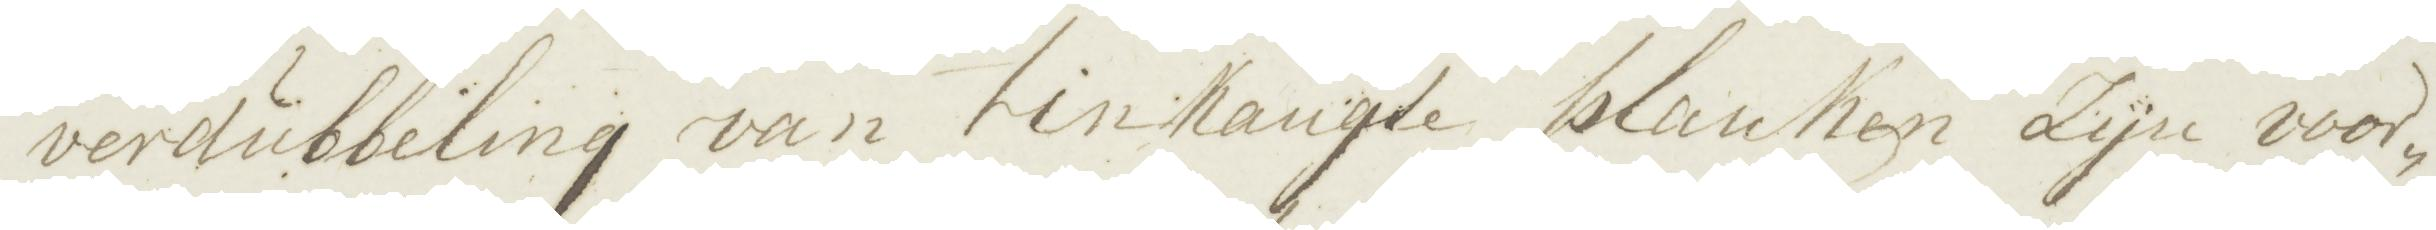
verdubbeling van tinkangse planken Zijn voor„
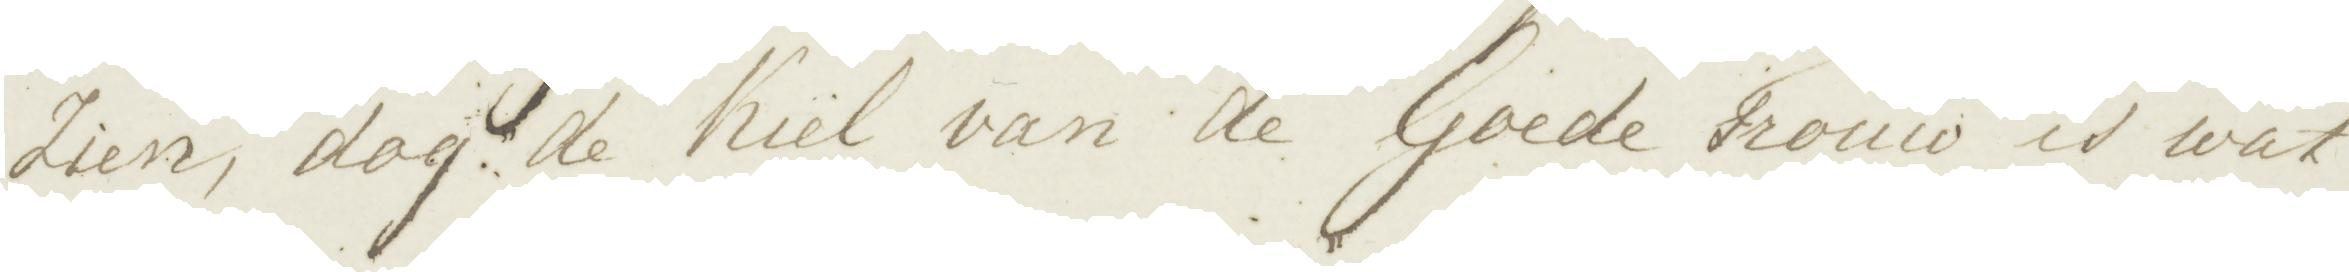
Zien, dog de Kiel van de Goede Trouw is wat
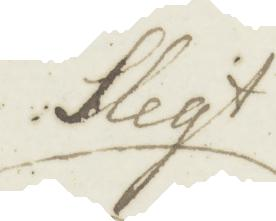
Slegt.
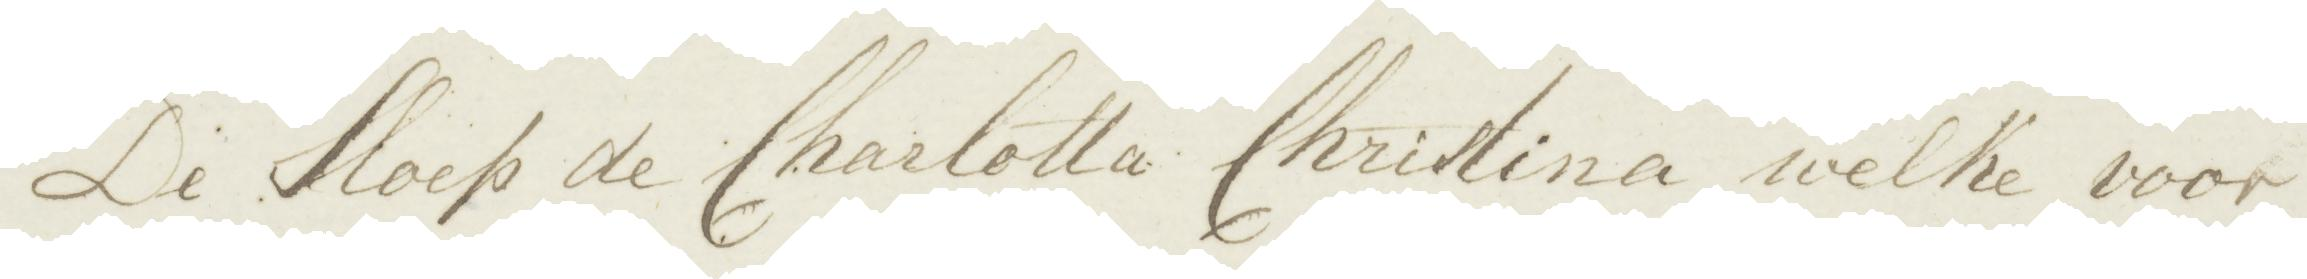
De Sloep de Charlotta Christina welke voor
